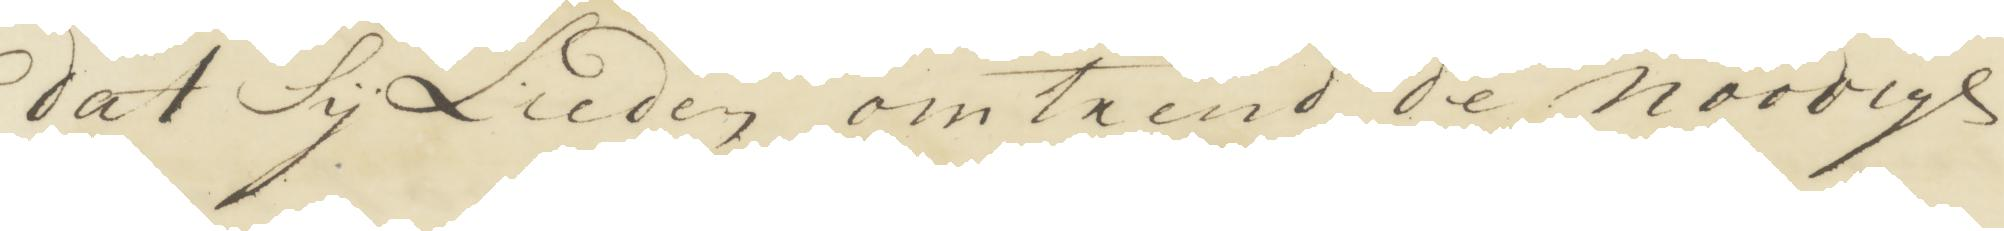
dat Sij Lieden omtrend de noodigen
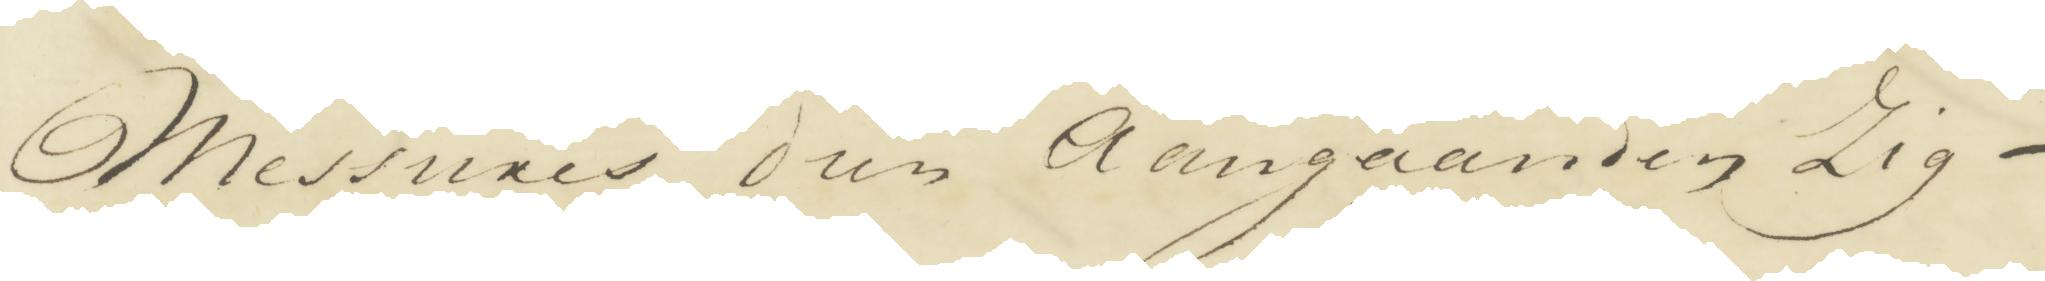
Messures dien aangaanden Zig
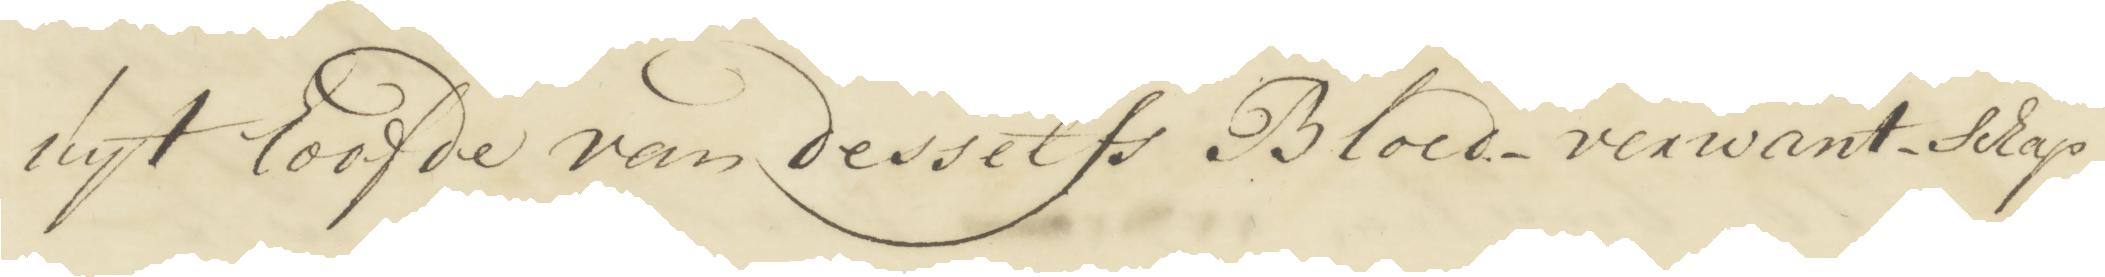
uyt hoofde van desselfs Bloed-verwant-schap
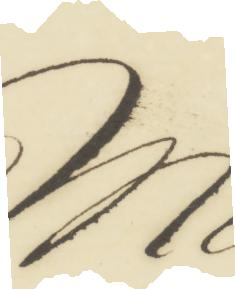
Met
